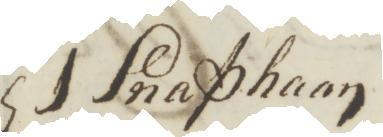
1 Snaphaan
